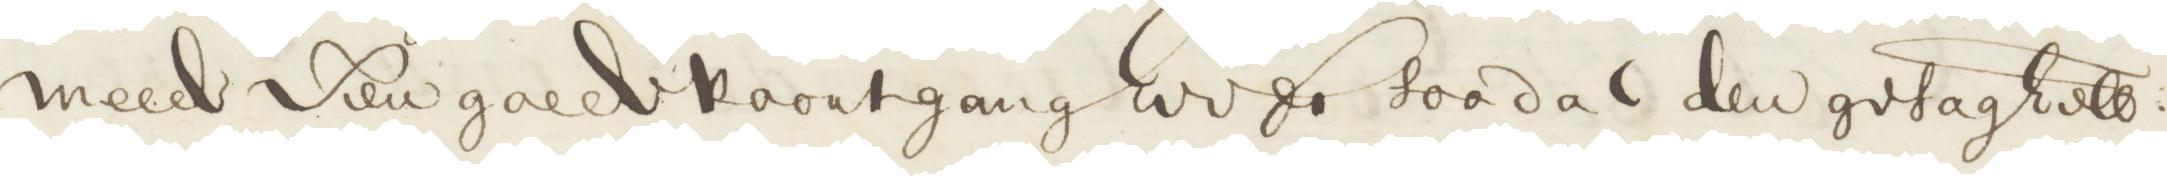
meede Een goede voortgang heeft soo dat den gesaghebb:
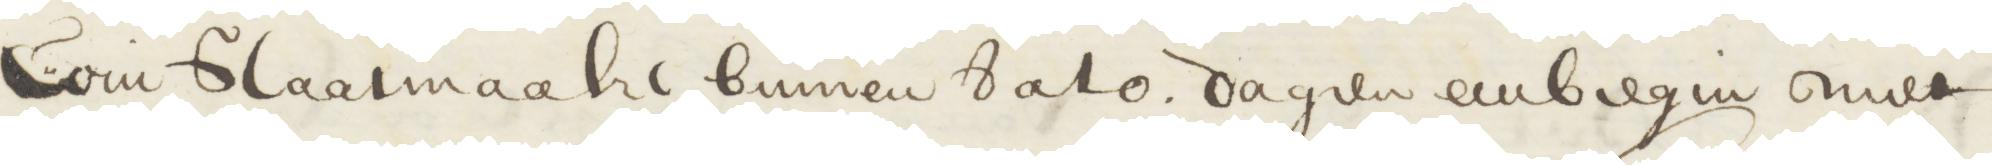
Coin staatmaakt binnen dato. dagen een begin met
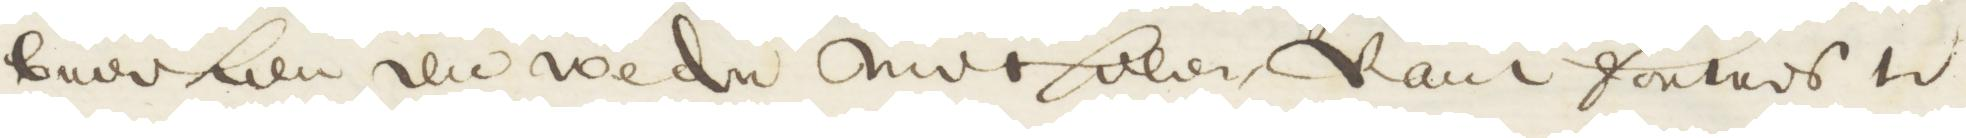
breeken en weder metselen van't fortres te
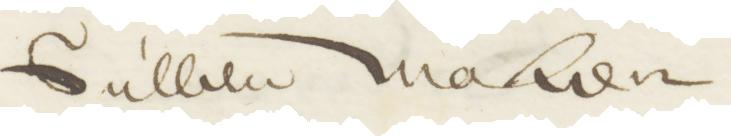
sullen maken
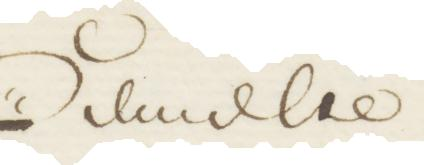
Gemelte
